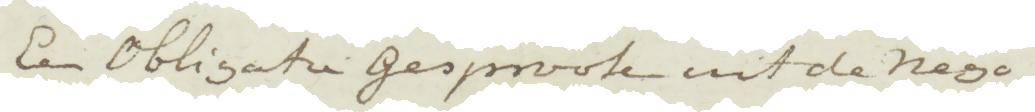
Een Obligatie gesprooten uit de nego.
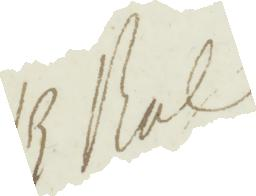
13 Rol
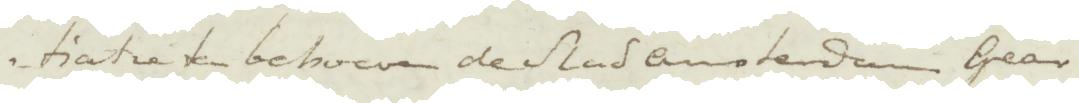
=tiatie ten behoeven de Stad amsterdam Gear
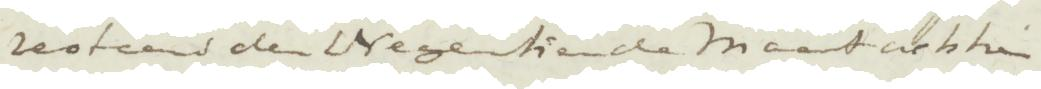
resteerd den Negentiende Maart achtien
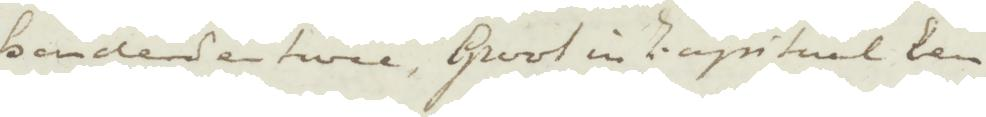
honderd en twee, Groot in kapitaal Een
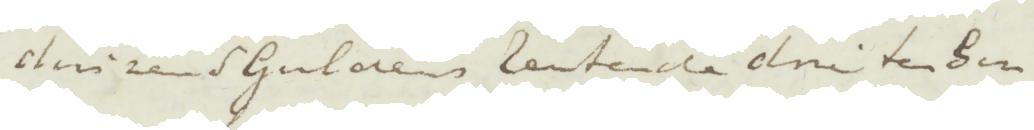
duizend Guldens rentende drie hon
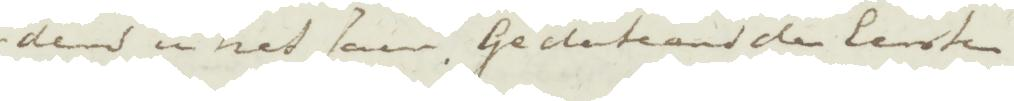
derd in het Jaar, Gedateerd den Eersten
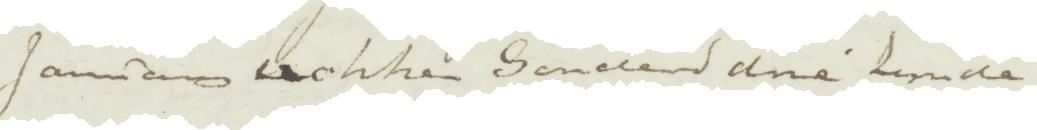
January achtien Honderd drie zynde
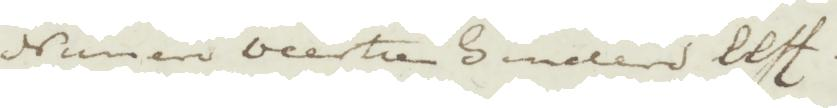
Numero veertien honderd Elff.
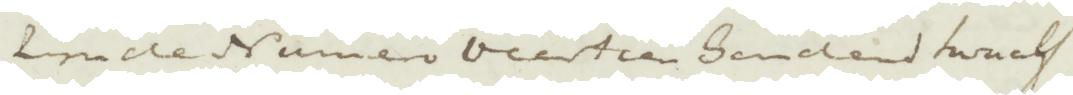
zynde Numero veertien honderd twaalf
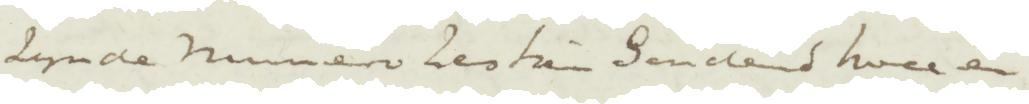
zynde numero zestien Honderd twee en
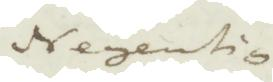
Negentig
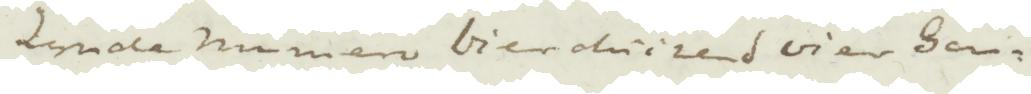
zynde numero vier duizend vier hon=
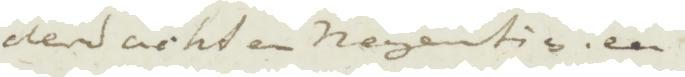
derd acht en negentig, een
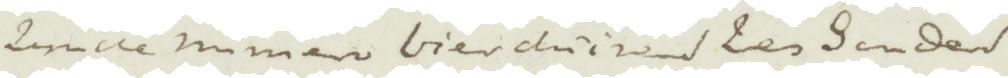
zynde numero vier duizend zes honderd
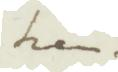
tien.
